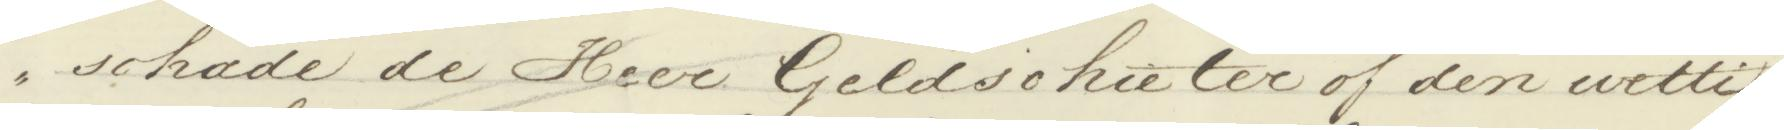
„ schade de Heer Geldschieter of den wetti
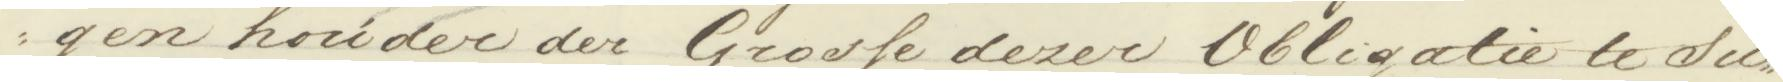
„ gen houder der Grosse dezer Obligatie te su„
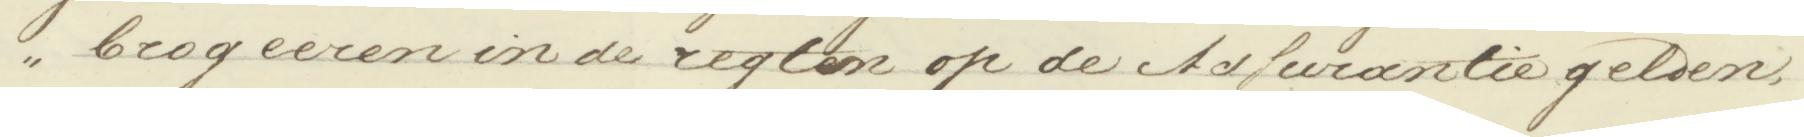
„ brogeeren in de regten op de Assurantie gelden,
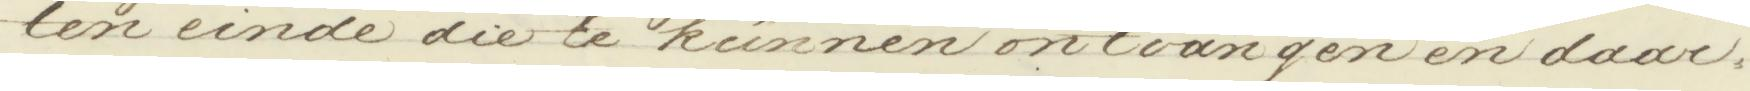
ten einde die te kunnen ontvangen en daar„
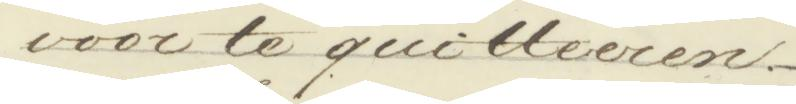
voor te quitteeren.
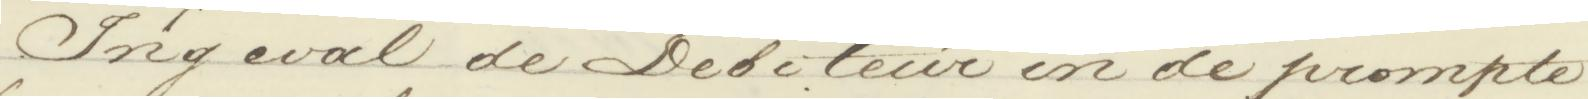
Ingeval de Debiteur in de prompte
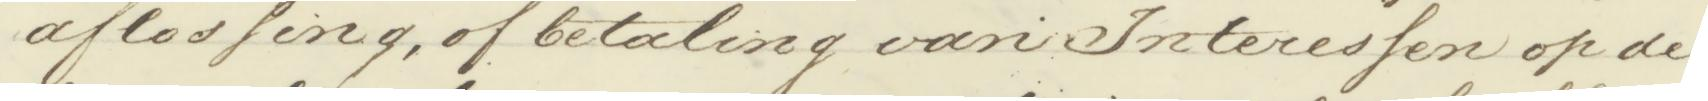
aflossing, of betaling van Interessen op de
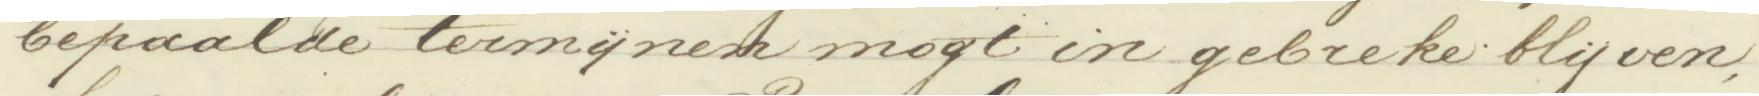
bepaalde termijnen mogt in gebreke blijven,
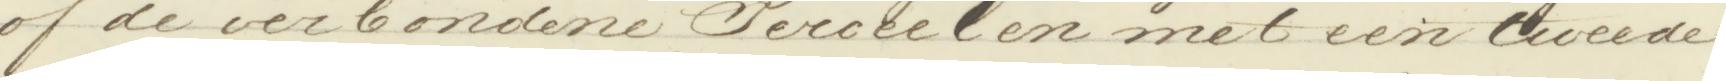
of de verbondene Perceelen met een tweede
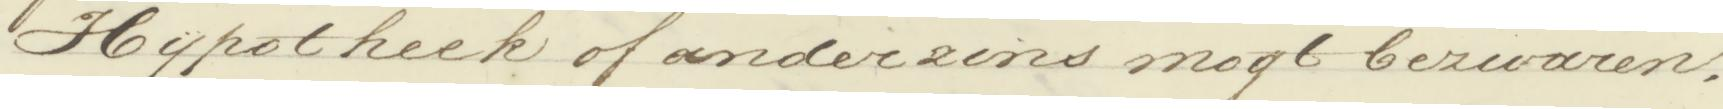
Hijpotheek of anderzins mogt bezwaren,
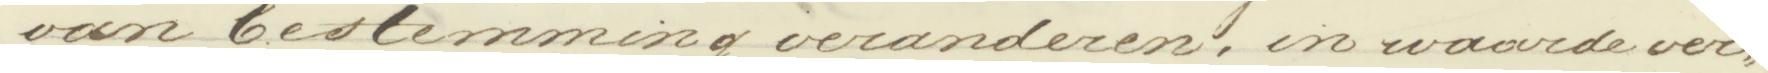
van bestemming veranderen, in waarde ver„
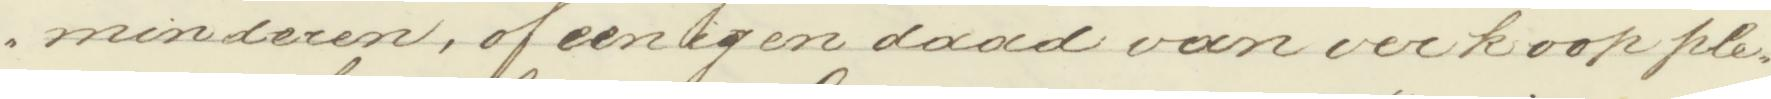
„minderen, of eenigen daad van verkoop ple„
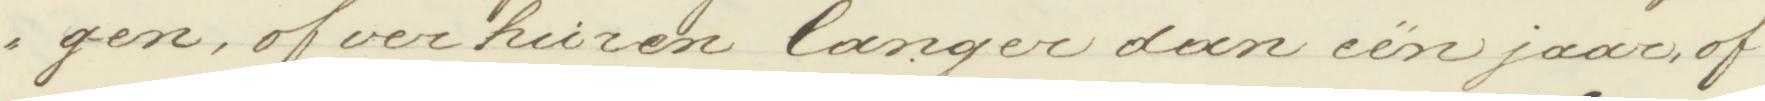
„gen, of verhuren langer dan één jaar, of
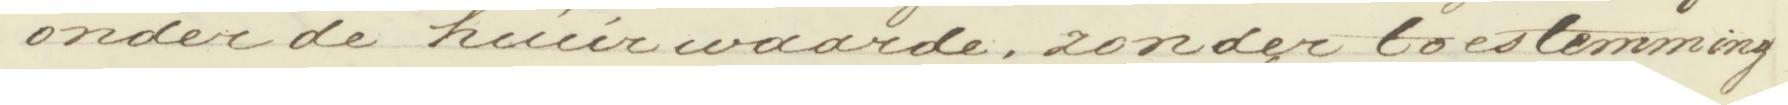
onder de huurwaarde, zonder toestemming
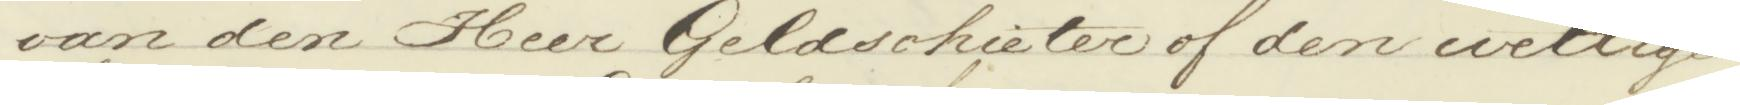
van den Heer Geldschieter of den wettige
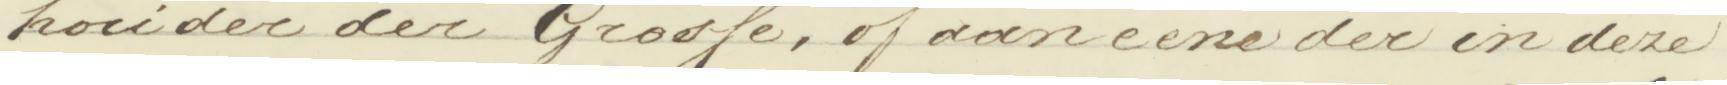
houder der Grosse, of aan eene der in deze
